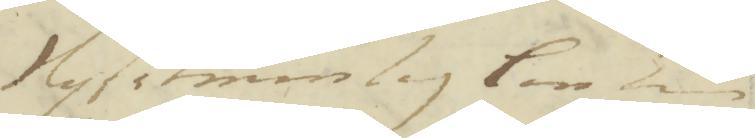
Vyf en twintig Cents
